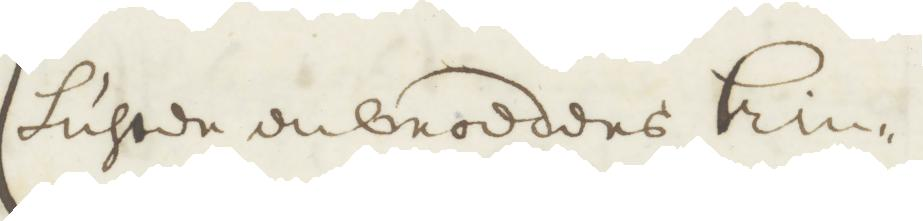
suster en broeders kin„
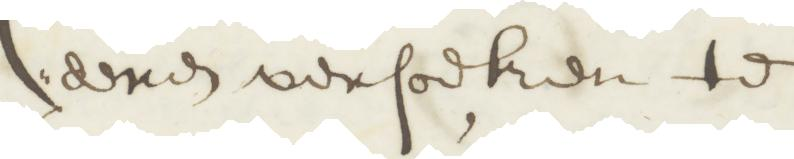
deren versoeken te
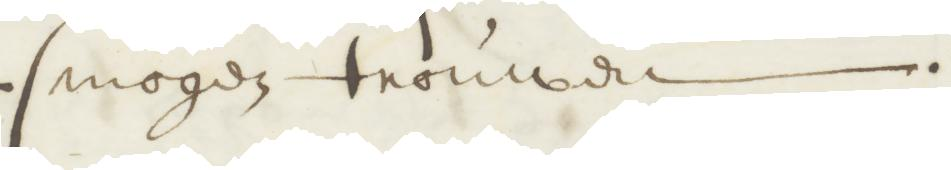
mogen trouwen.
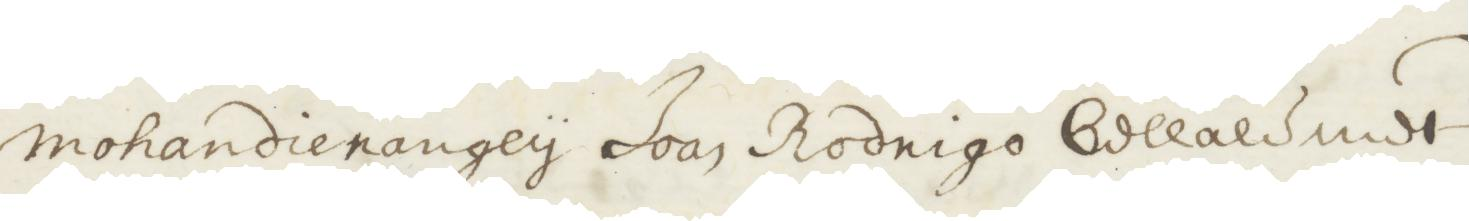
mohandierangeij Ioan Rodrigo bellale met
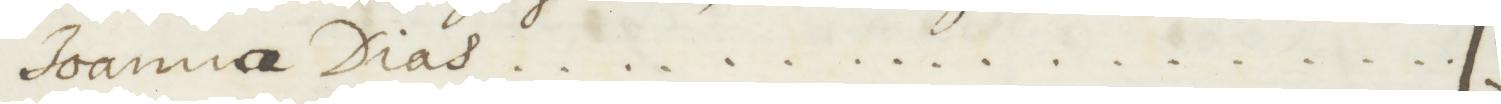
Ioanna Dias . . . . . . . . . . . . . . . . . .
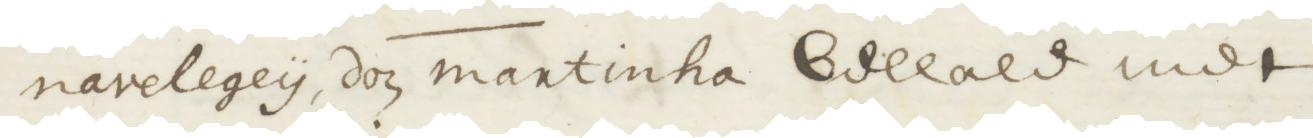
navelegeij, don martinha bellale met
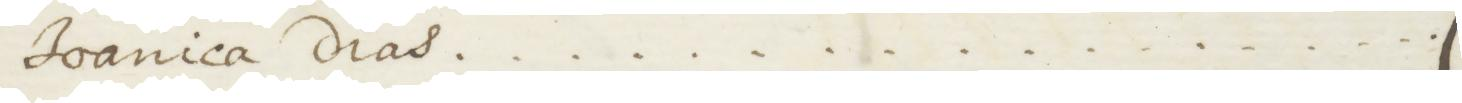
Ioanica dias. . . . . . . . . . . . . . . . . .
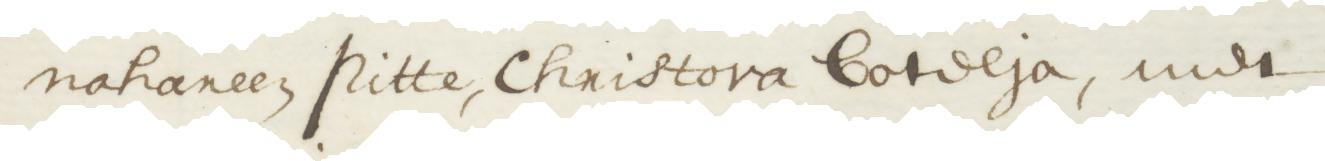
nahareen Pitte, Christora botelja, met
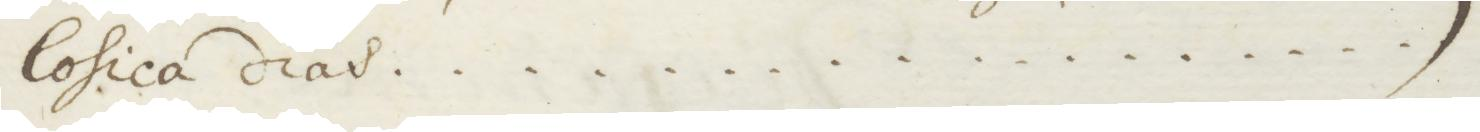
Losica dias. . . . . . . . . . . . . . . . . .
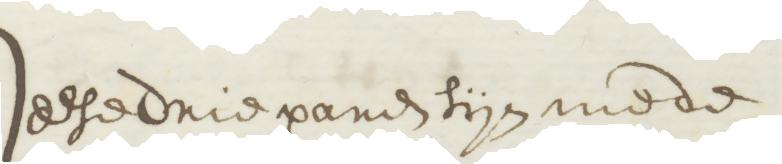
dese drie paren sijn mede
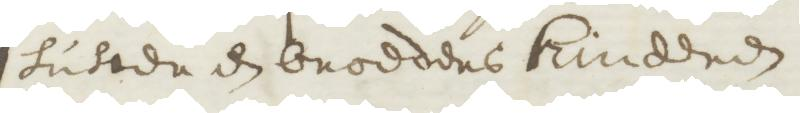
suster en broeders kinderen
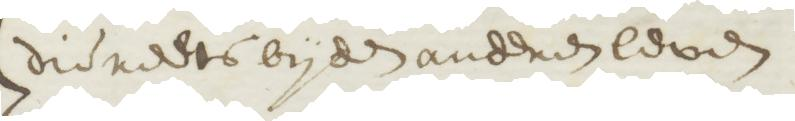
die reets bij den anderen leven
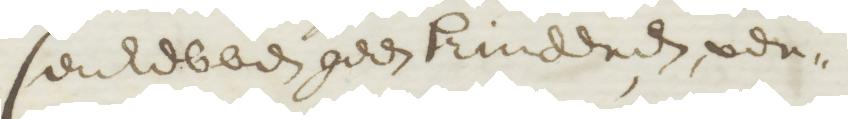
en hebben geen kinderen, ver„
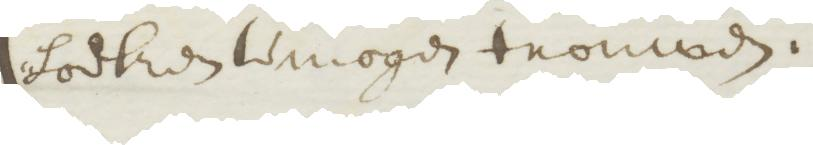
soeken te mogen trouwen.
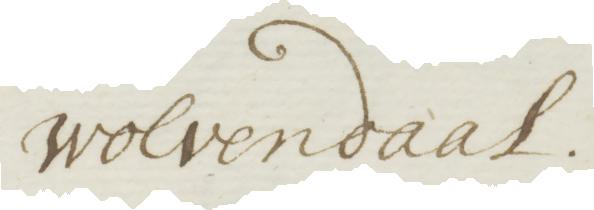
wolvendaal.
